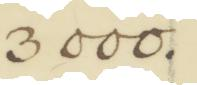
3000.
